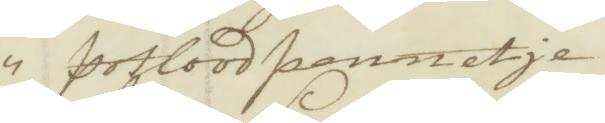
„ potlood pennetje
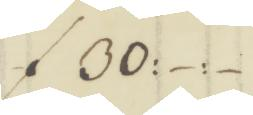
ƒ 30:—:—
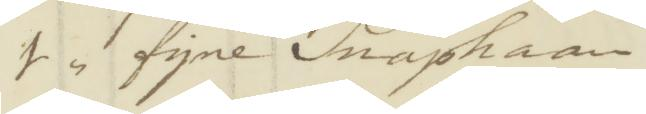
1 „ fijne Snaphaan
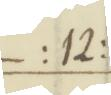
:12
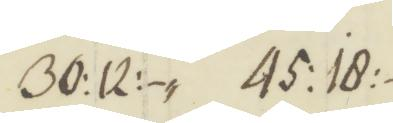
30:12:-„ 45:18:
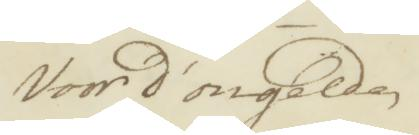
voor d’ongelden
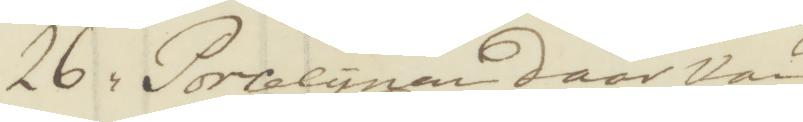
26„ Porcelijnen daar van
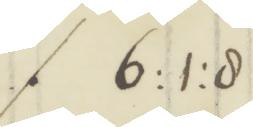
.ƒ 6:1:8
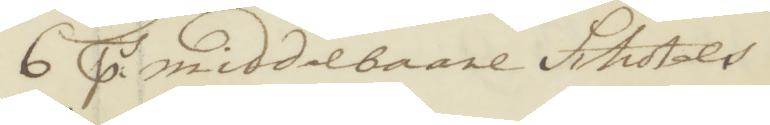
6 p:s middelbaare schotels
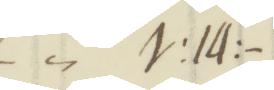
„ 1:14:–
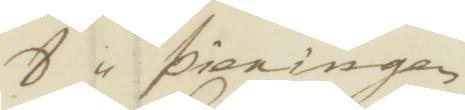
8 „ pieringen
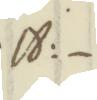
18:–
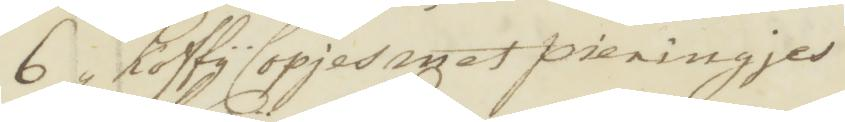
6 „ koffij Copjes met pieringjes
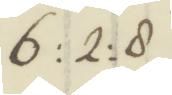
6:2:8
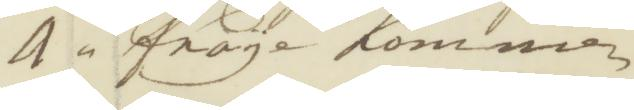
4 „ fraije kommen
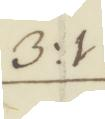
3:1
